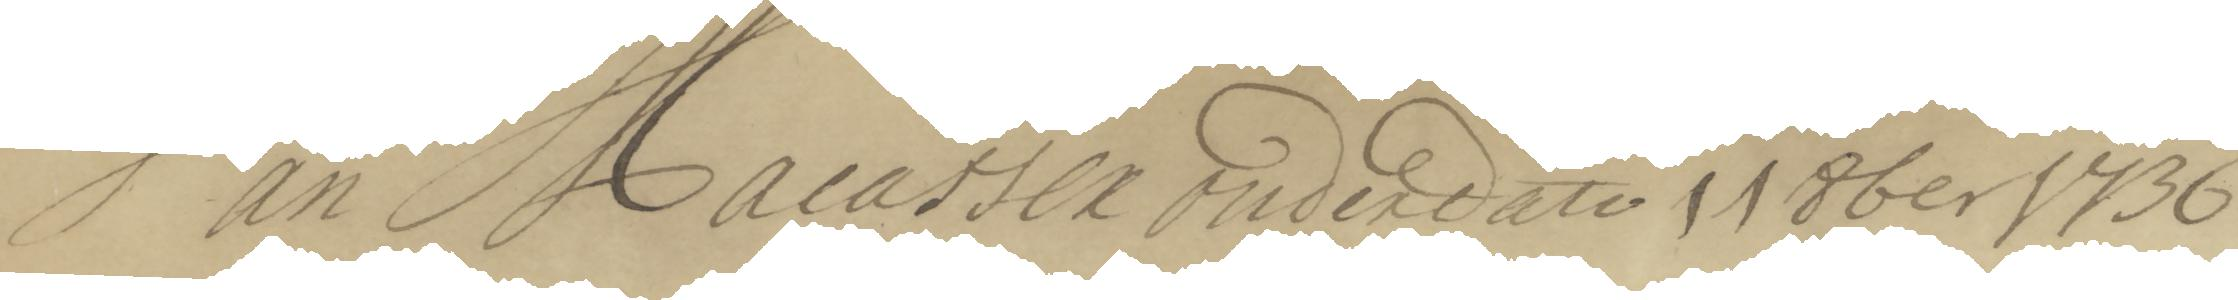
Van Macasser onderdato 11 8ber 1736
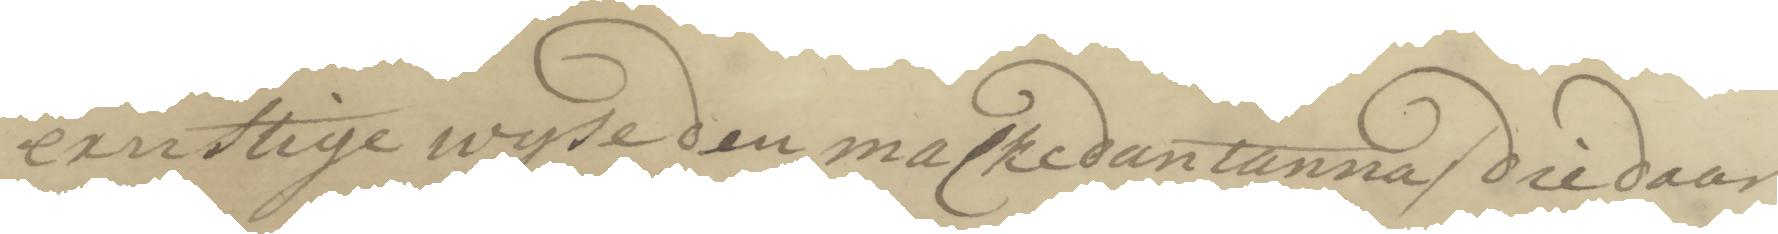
ernstige wyse den mackedantanna/ die daar
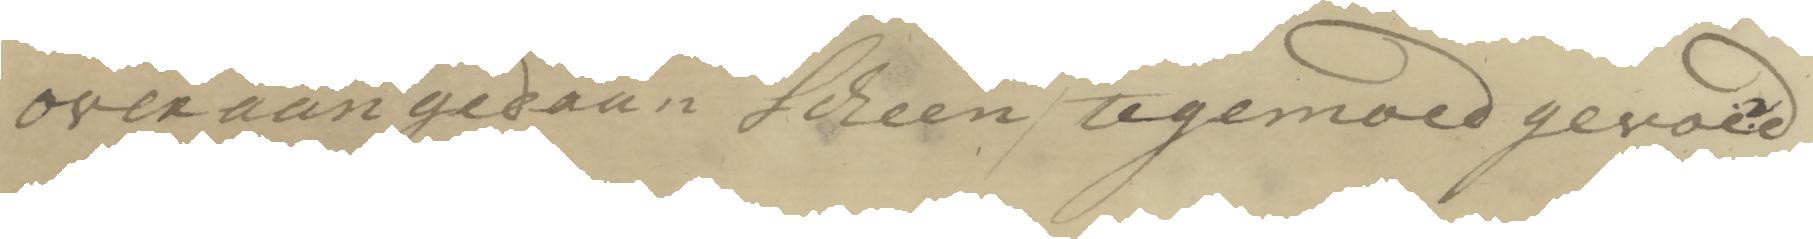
over aan gedaan scheen/ tegemoed gevoerd
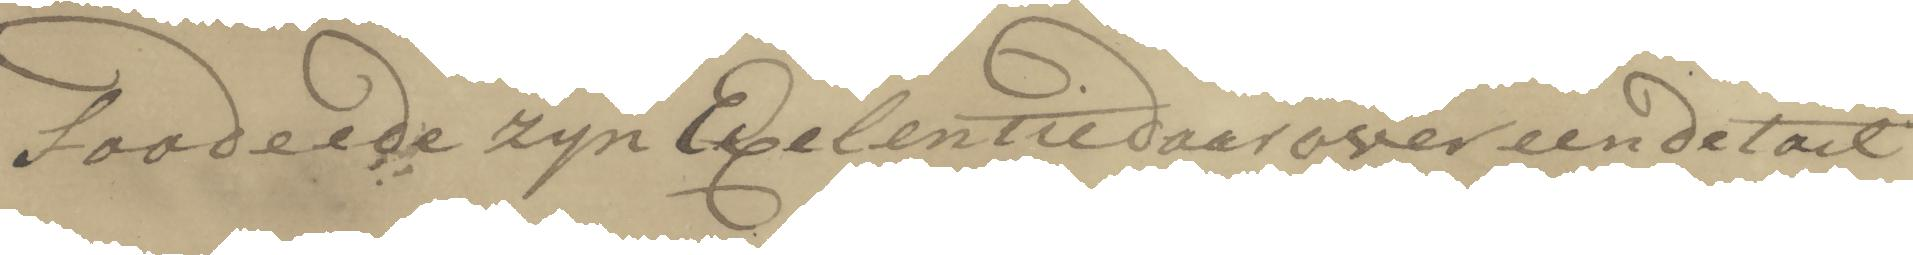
soodeede zyn Exelentie daar over een detail
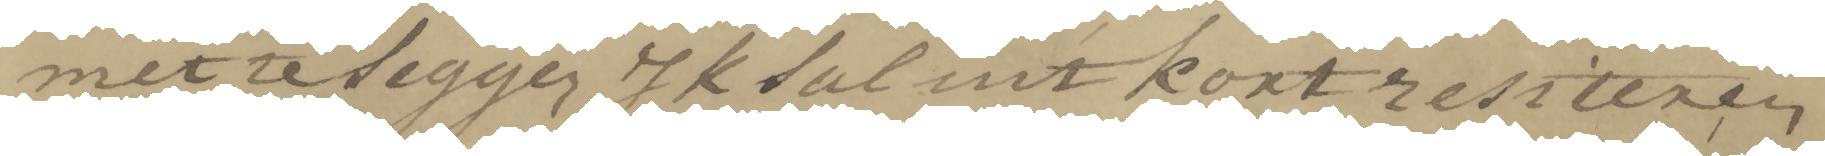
met te seggen Jk sal in't kort resiteren
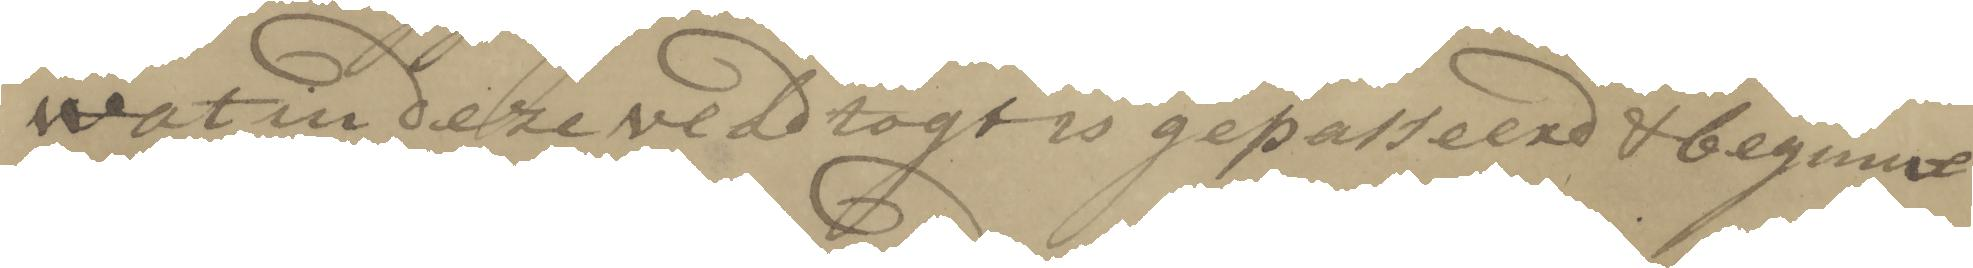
wat in deze veldtogt is gepasseerd & beginne
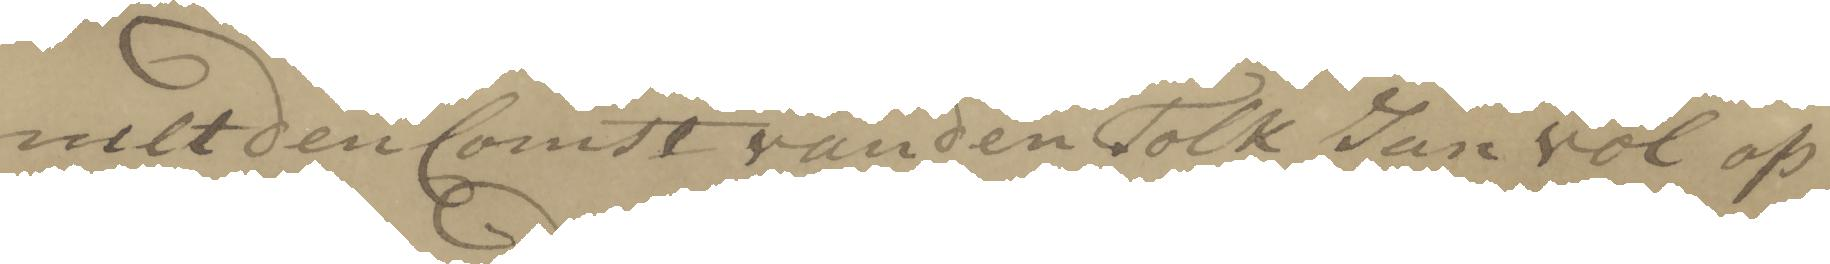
met den Comst van den Tolk Ian vol op
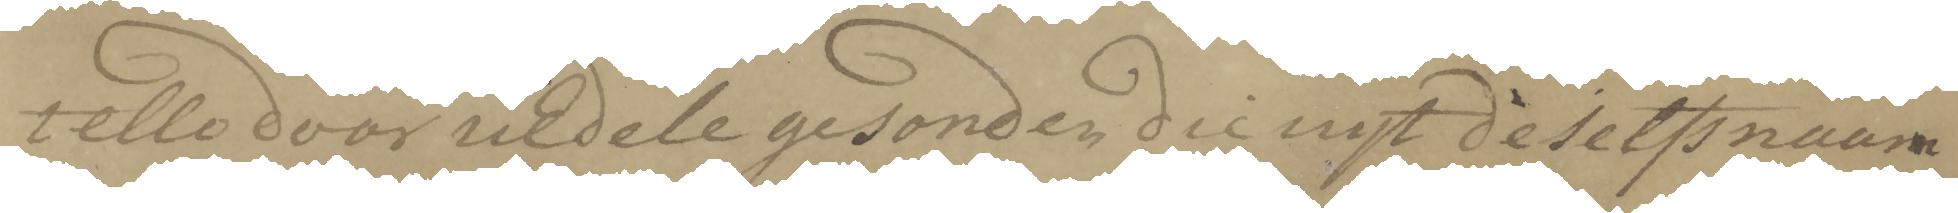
tello door uEdele gesonden die uijt deselfs naam
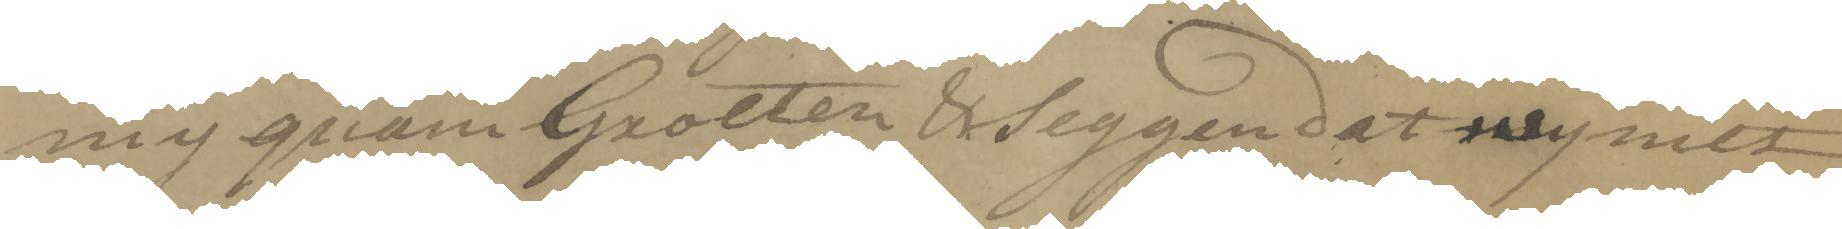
my quam Groeten & seggen dat wy met
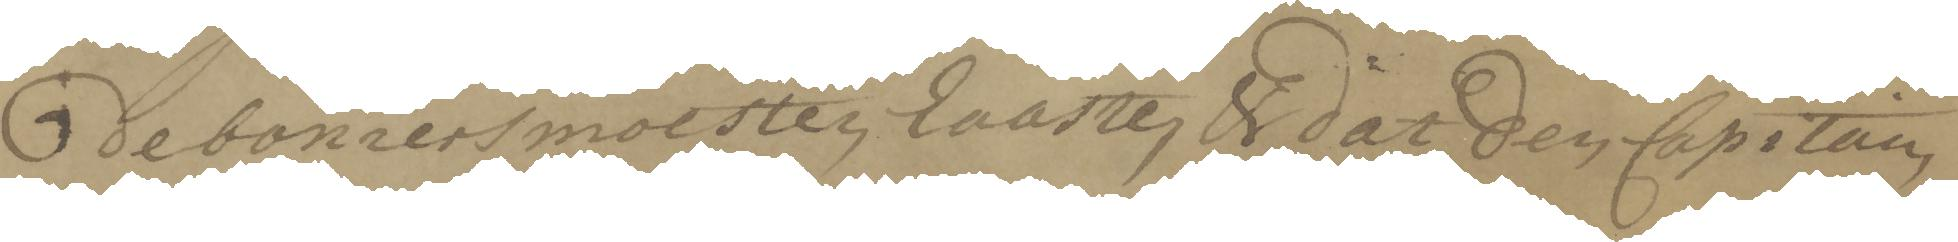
de boniers moesten haasten & dat den Capitain
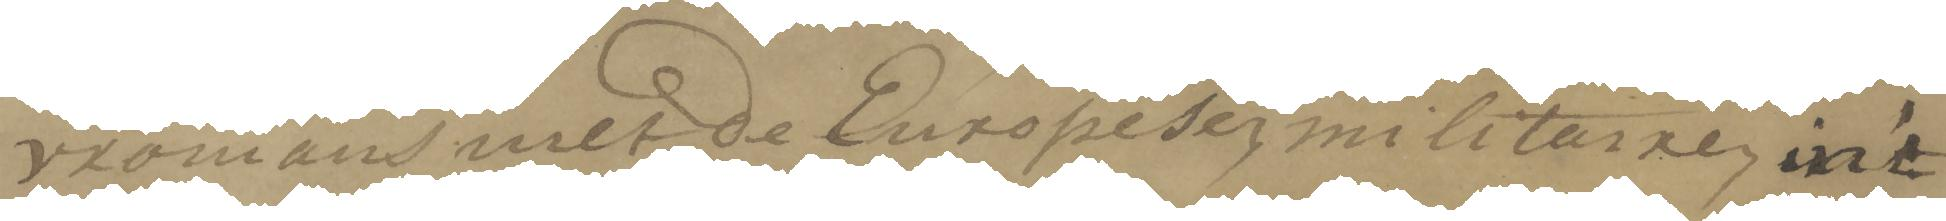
vromans met de Europesen militairen in't
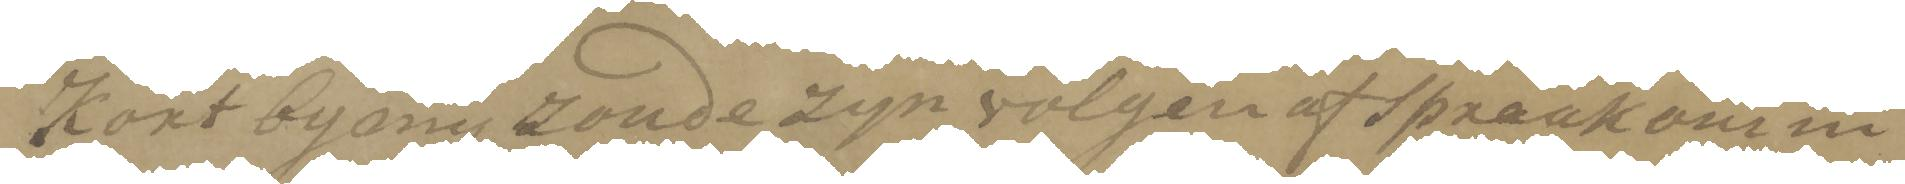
kort by my zoude zyn volgen afspraak om in
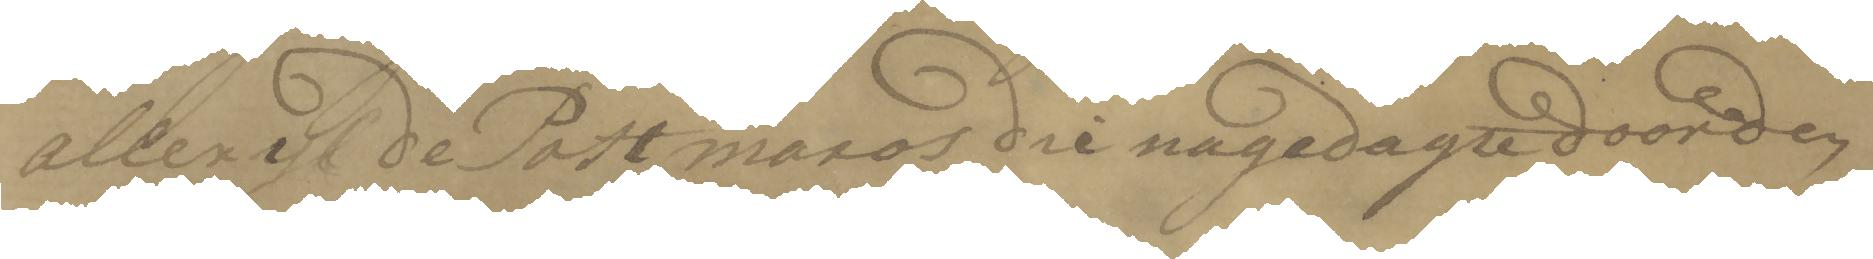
alleryl de Post maros die nagedagte door den
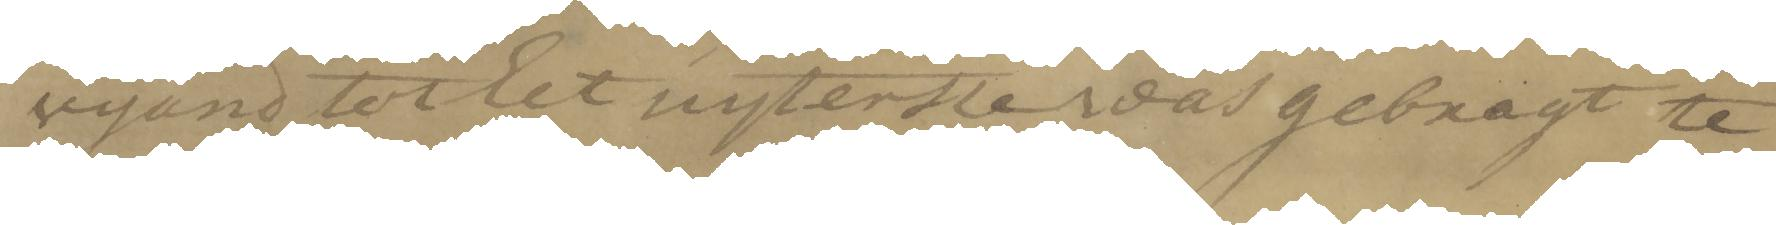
vyand tot het uijterste was gebragt te
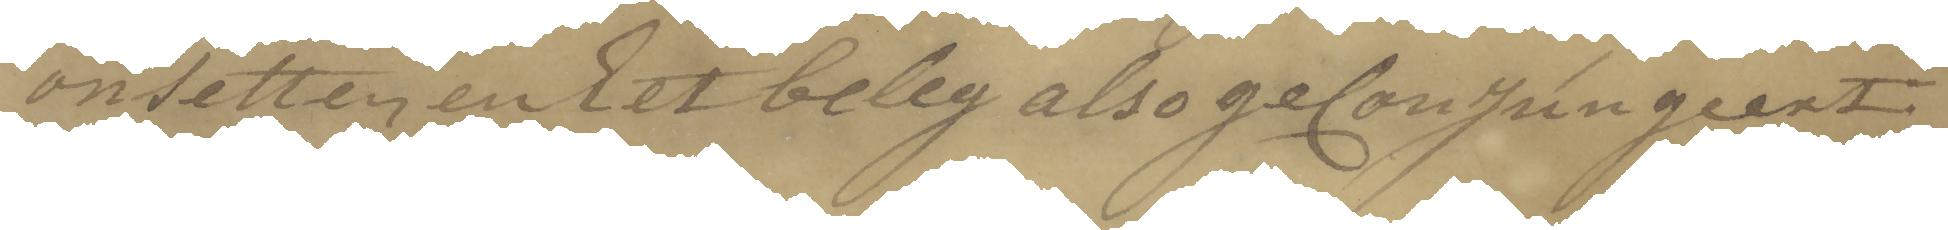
onsetten en het beleg also geconjungeert:
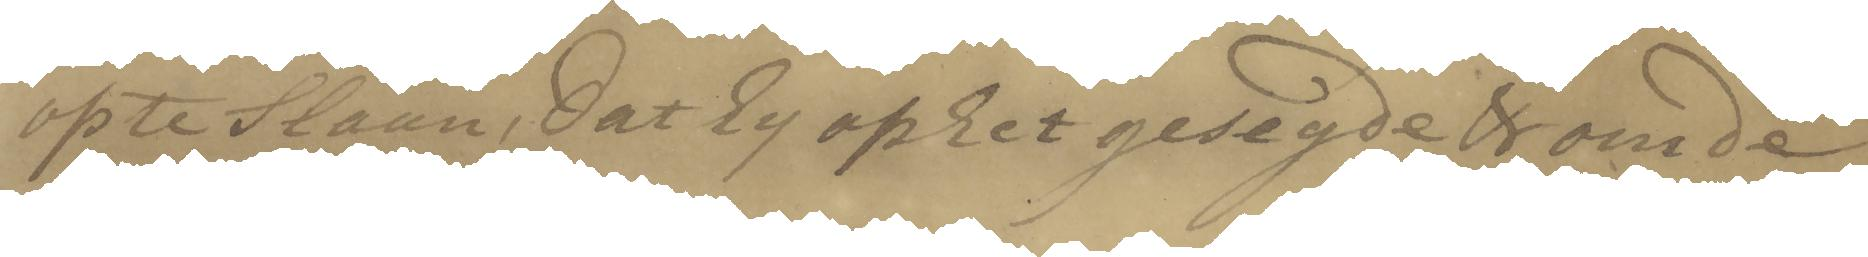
op te slaan, dat hy op het gesegde & om de
